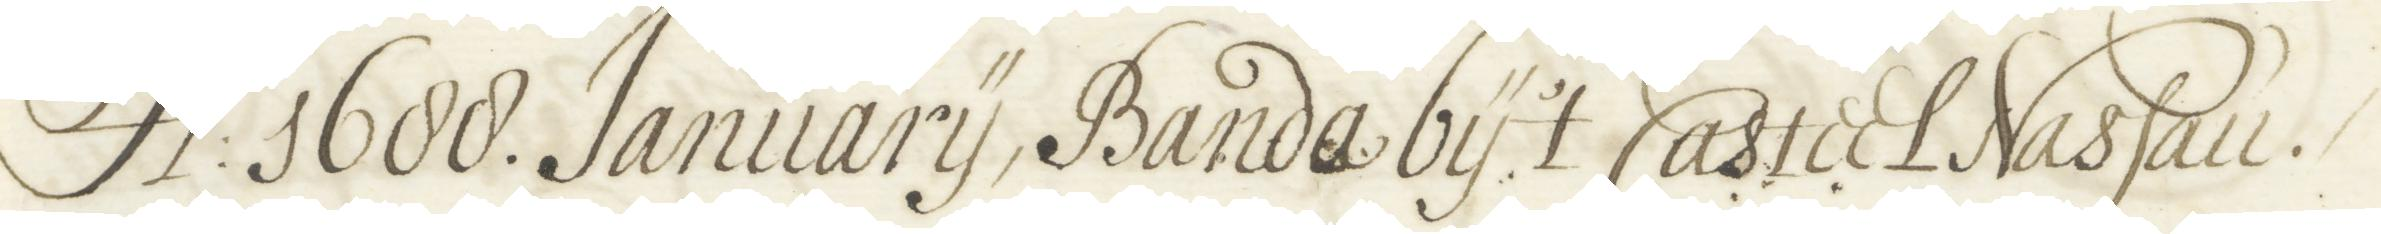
A:o 1688. Januarij, Banda bij ’t Casteel Nassau.
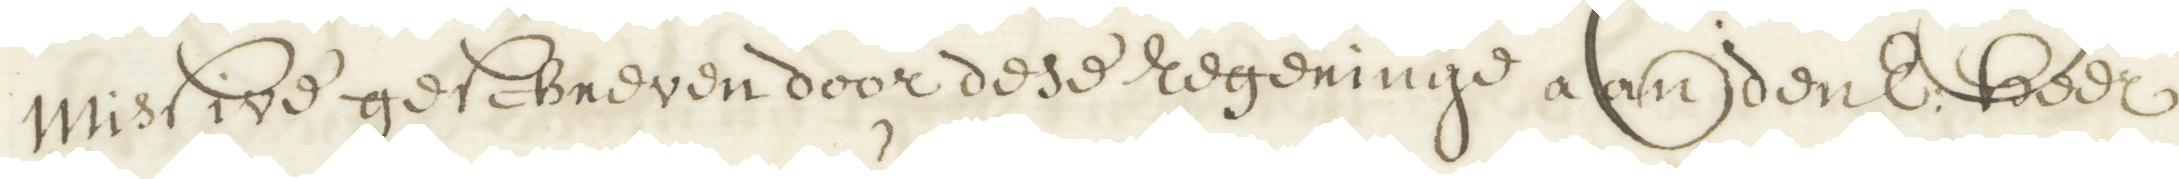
missive geschreven door dese regeringe aan den E: Heer
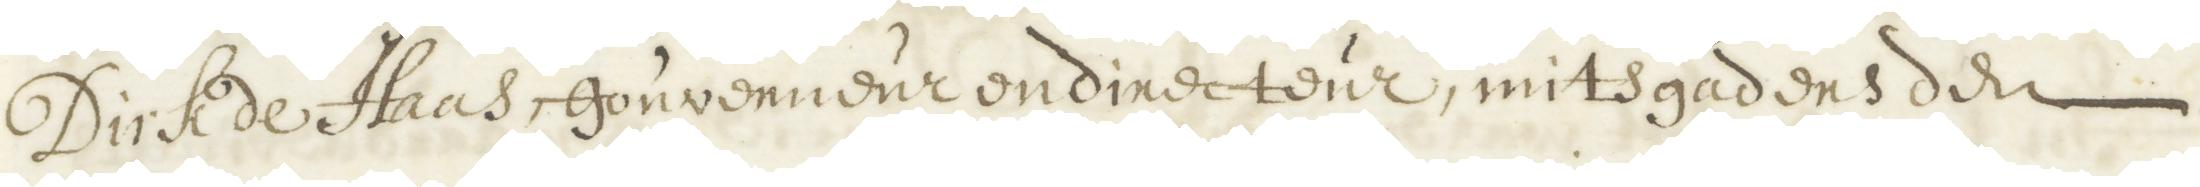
Dirk de Haas, gouverneur en directeur, mitsgaders den
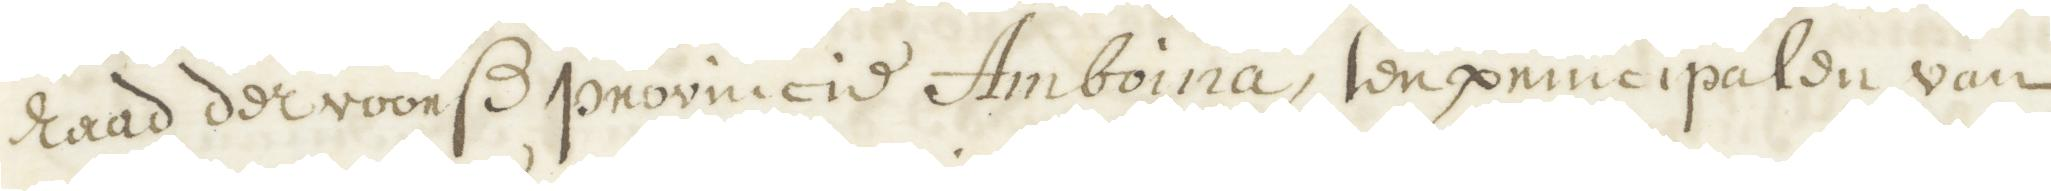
raad der voorsz provincie Amboina, ten principalen van
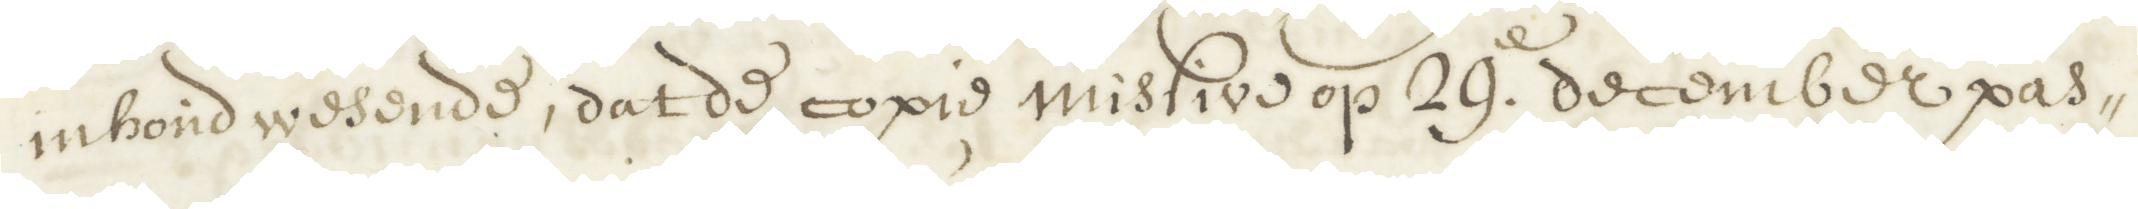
inhoud wesende, dat de copie missive op 29.e december pas„
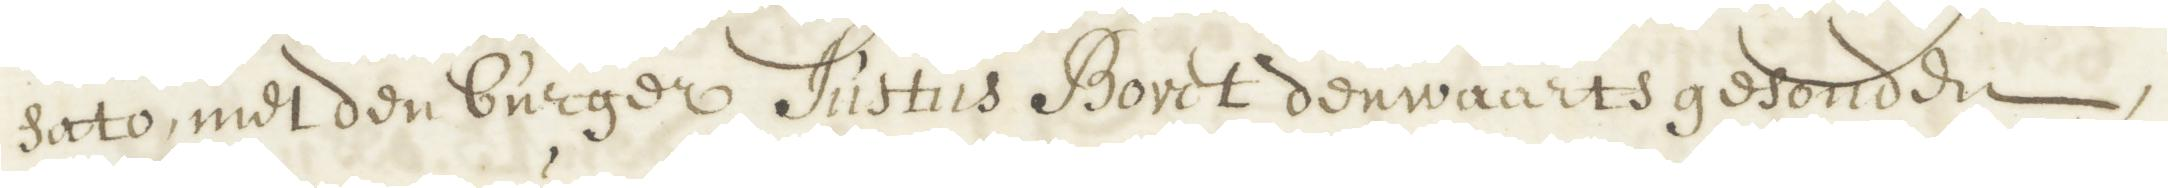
sato, met den burger Justus Bovet derwaarts gesonden,
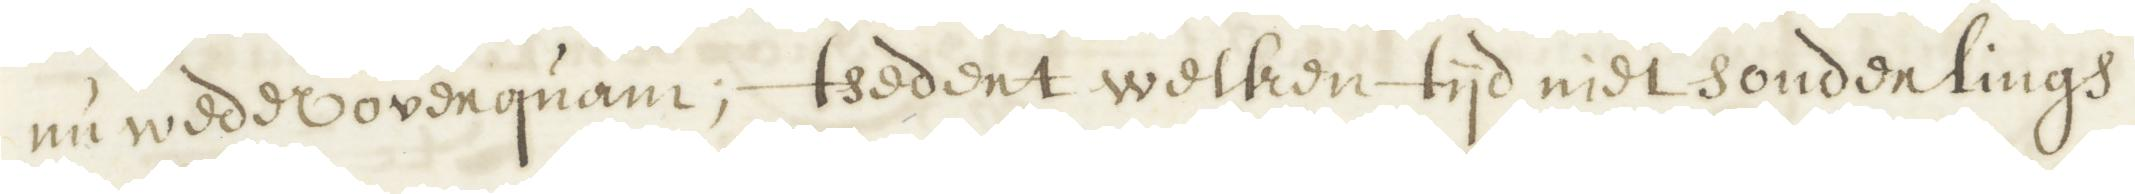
nu weder overquam; tsedert welken tijd niet sonderlings
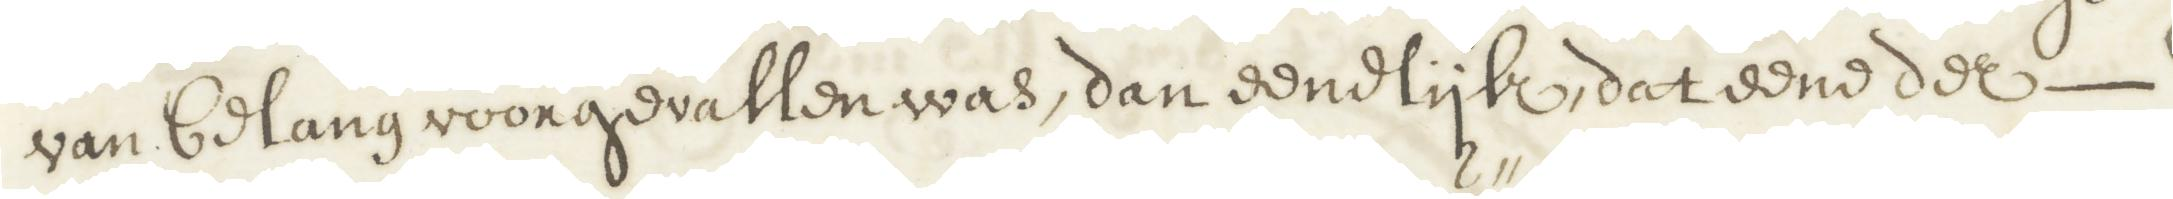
van belang voorgevallen was, dan eenelijk, dat eene der —
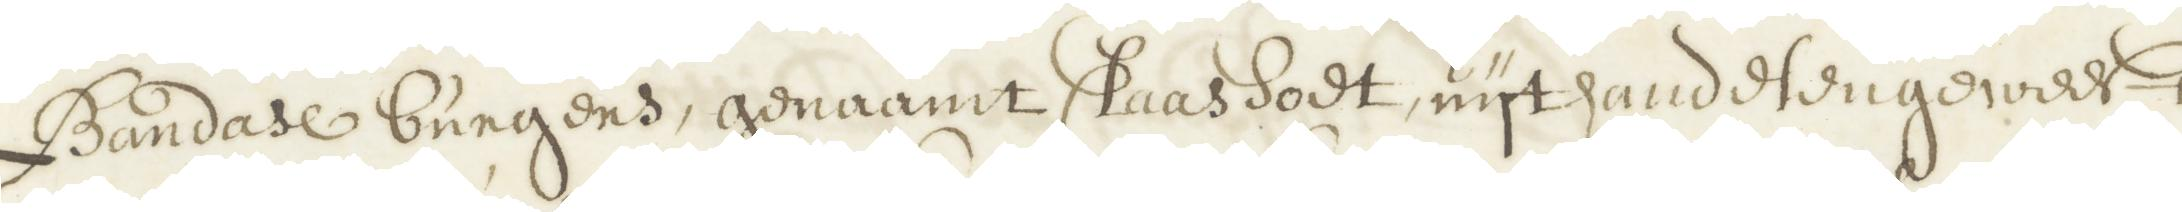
Bandase burgers, genaamt Claas Soet, uijt handelen geweest
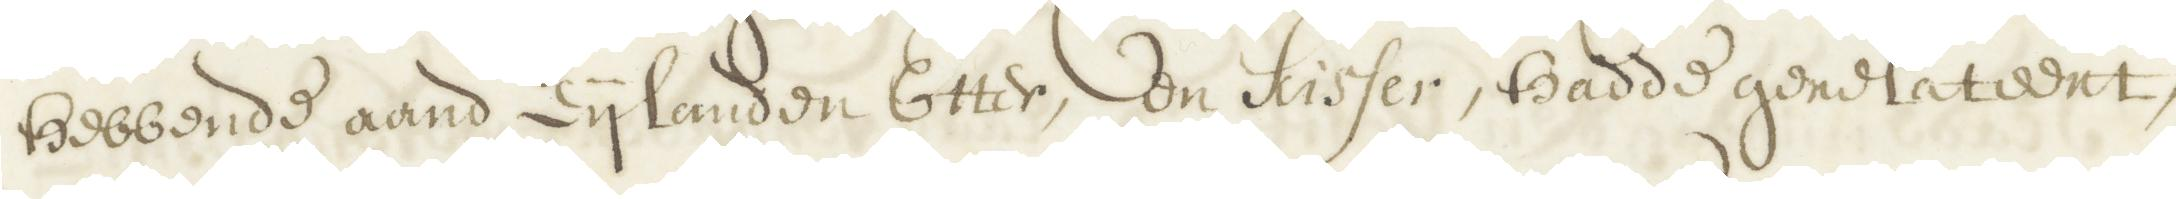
hebbende aan d' eijlanden Etter, en kisser, hadde gerelateert,
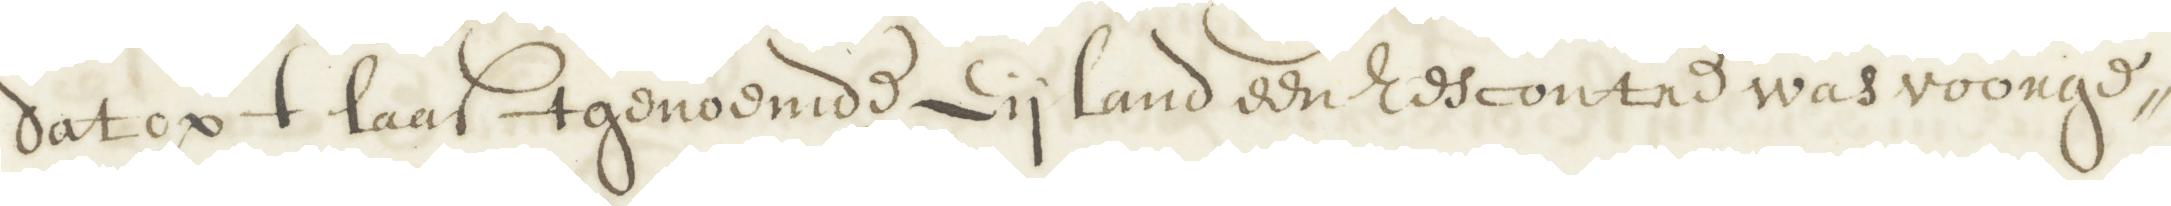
dat op ’t laast genoemde eij land een rescontre was voorge„
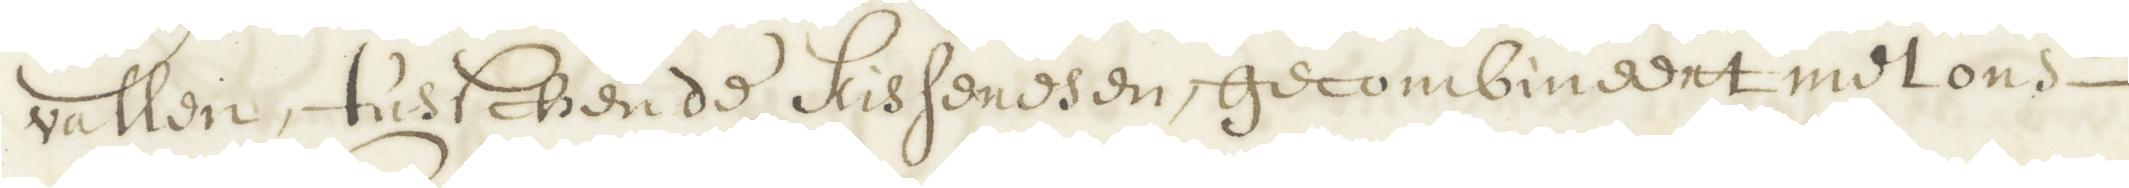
vallen, tusschende kisseresen, gecombineert met ons —
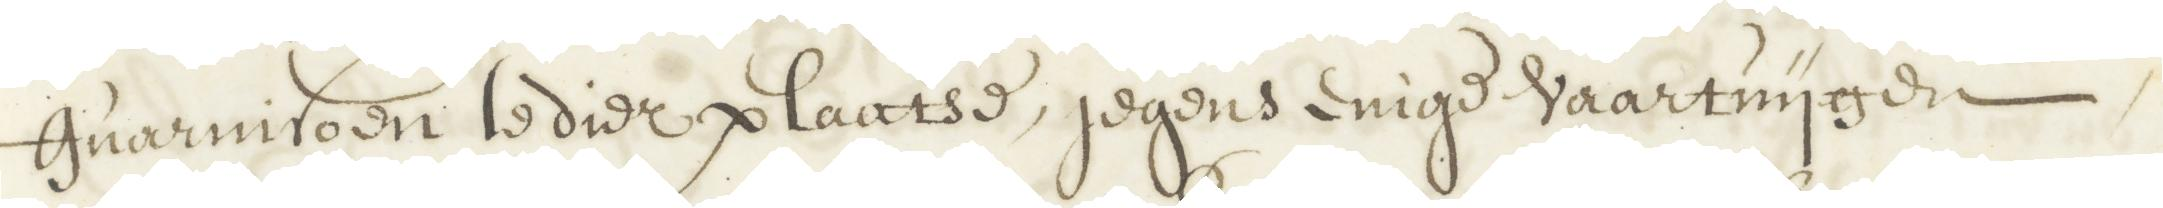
guarnisoen te dier plaatse, jegens enige vaartuijgen,
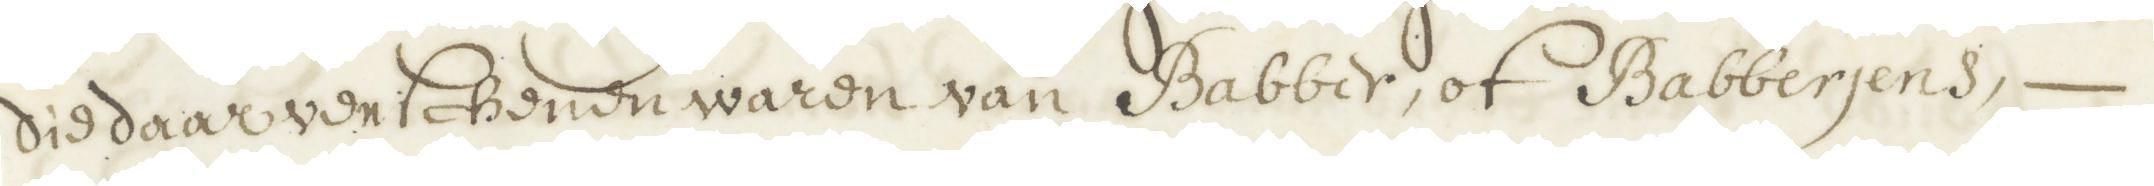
die daar verschenen waren van Babber, of Babberjens, —
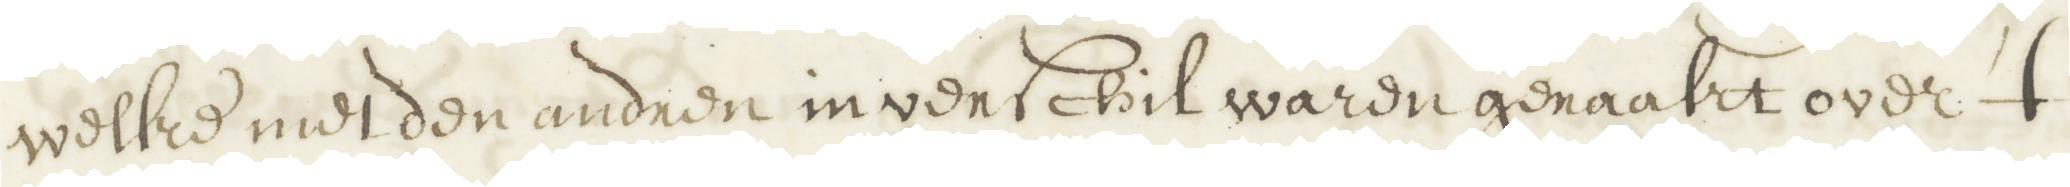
welke met den andren in verschil waren geraakt over ’t
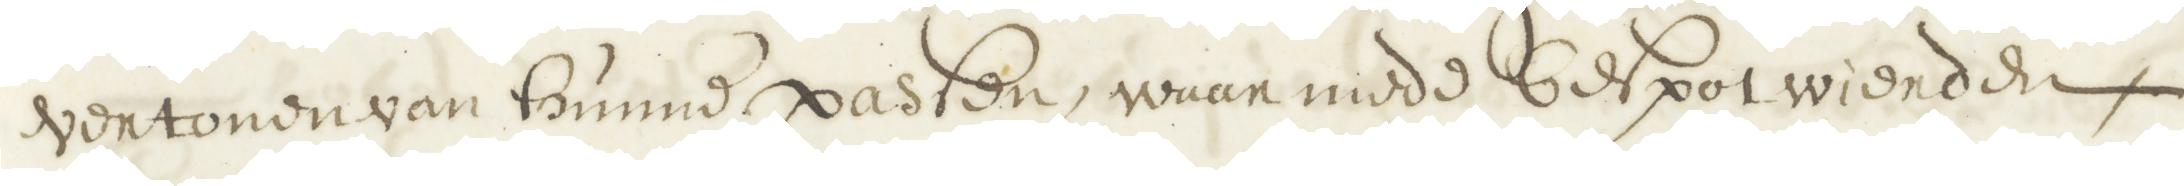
vertonen van hunne passen, waar mede bespot wierden,
